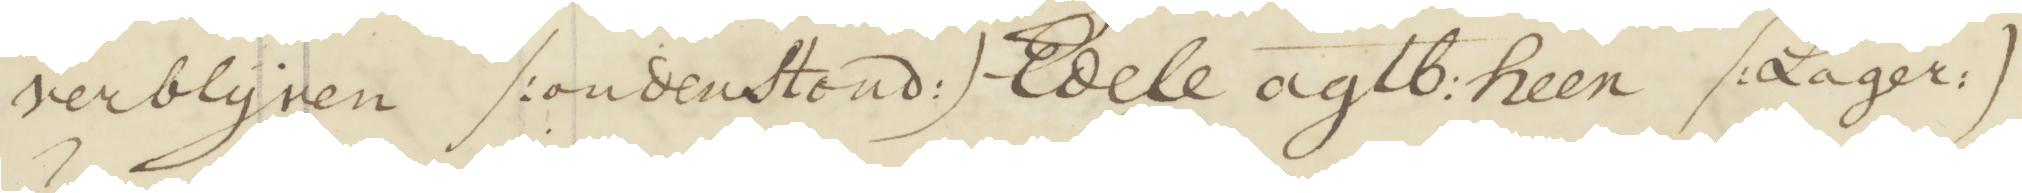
verblijven /:onderstond:) Edele agtb: heer /:Lager:)
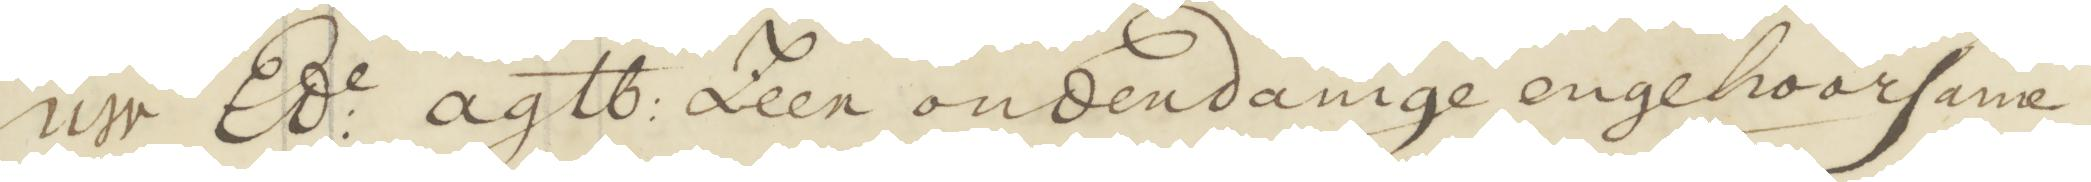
uw Ed:l agtb: zeer onderdanige engehoorsame
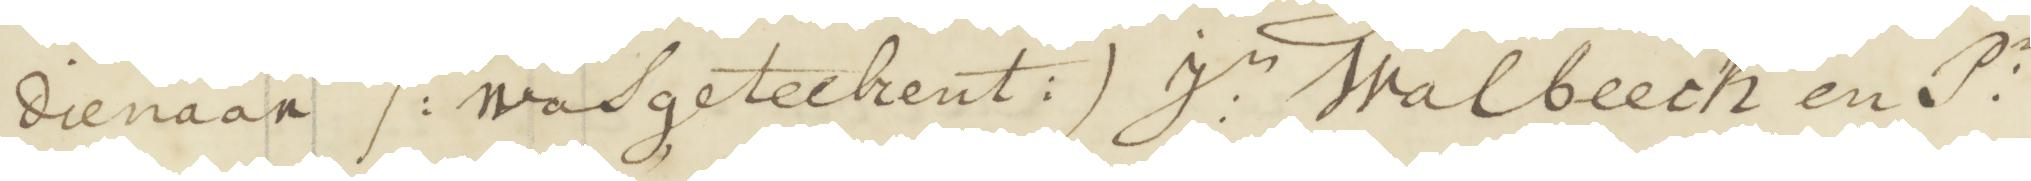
dienaar /:was geteekent:) J:n Walbeeck en P:r
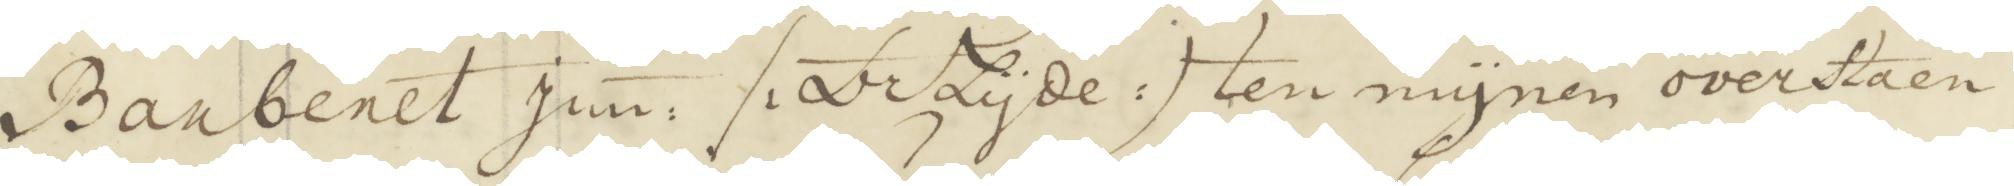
Barberet Jun: /:terzijde:) ten mijnen overstaen
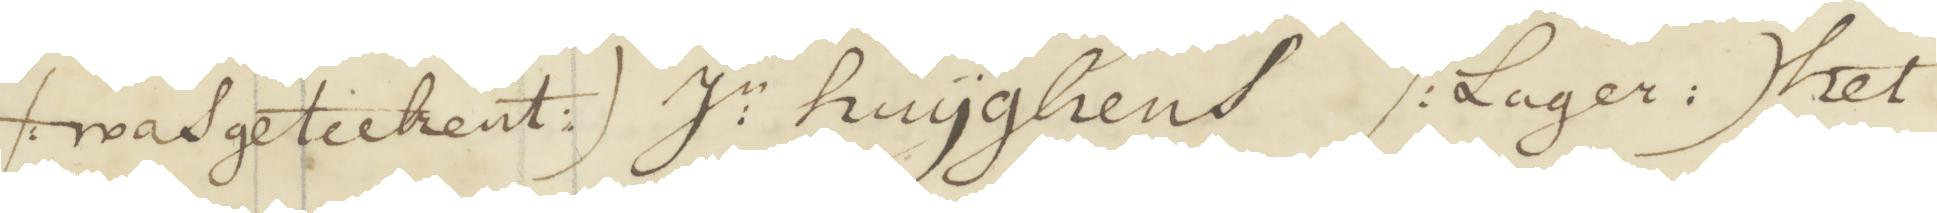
/:was geteekent:) J:n huijghens /:Lager:) het
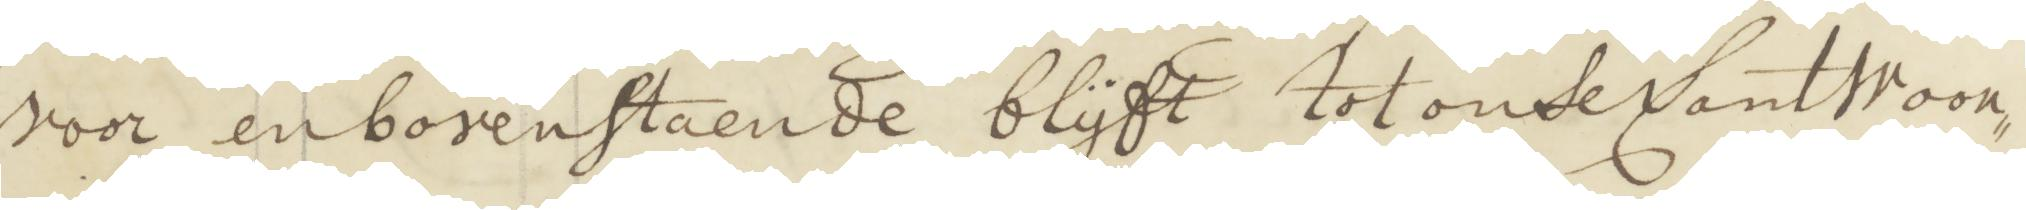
voor en bovenstaende blijft tot onse verantwoor„
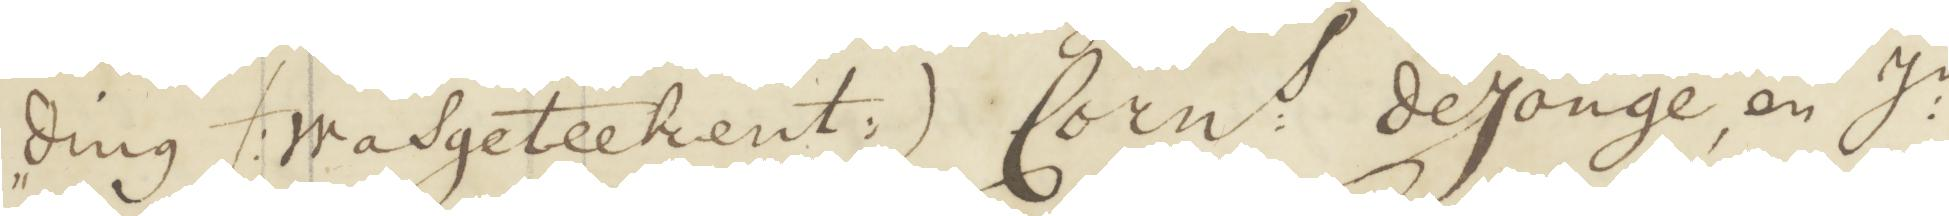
„ding /:was geteekent:/ Corn:s dejonge, en J:n
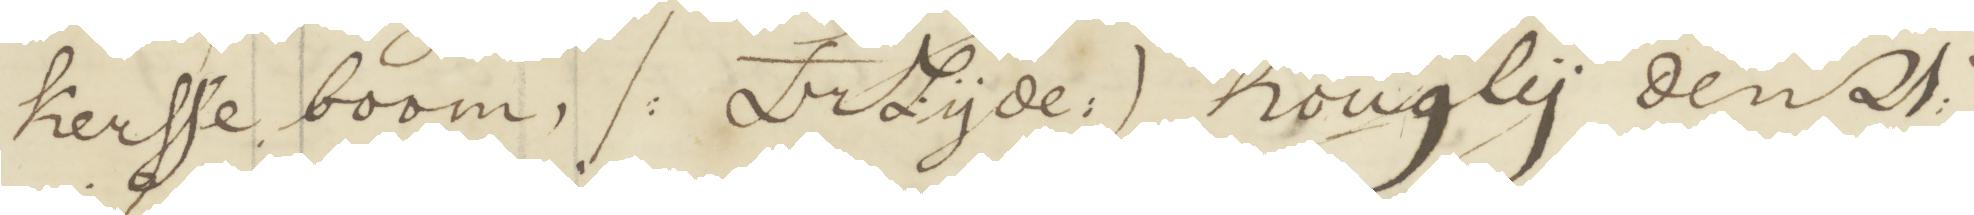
kersse boom, /:terzijde:) houglij den 21:'
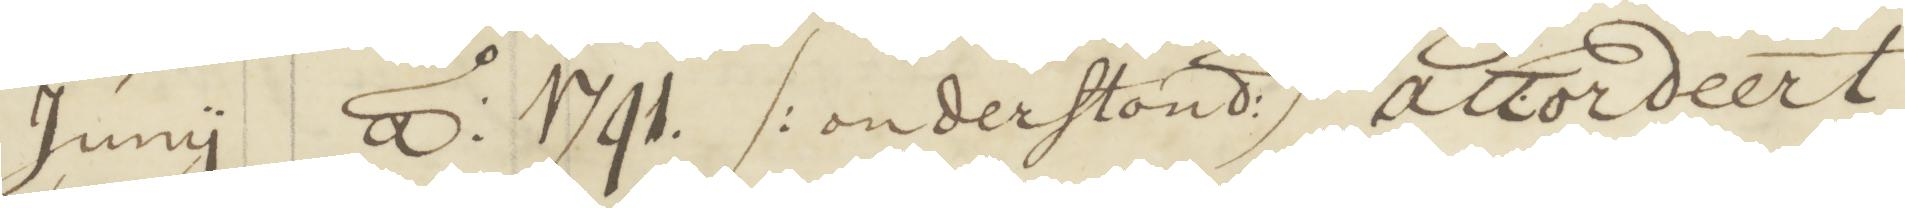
Junij a:o 1741. /:onderstond:) accordeert
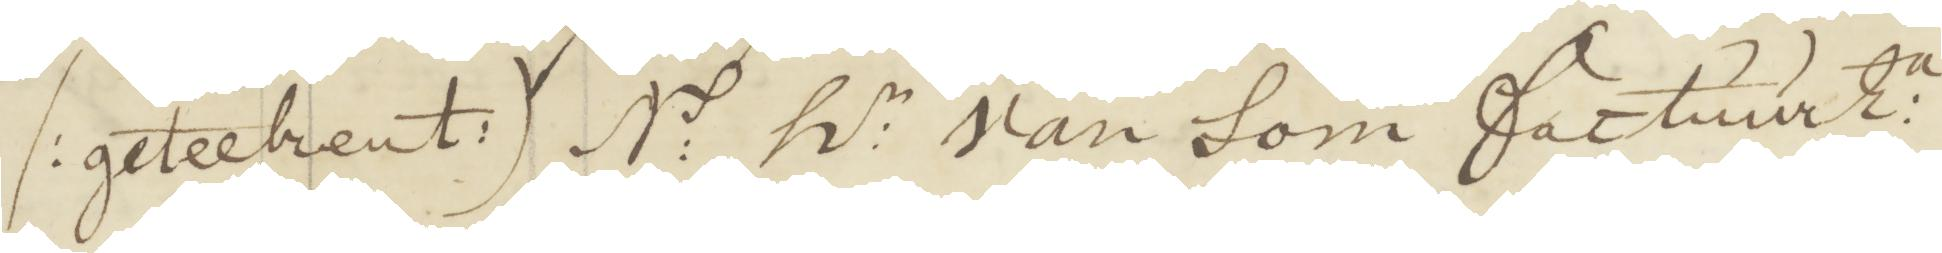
/:geteekent:) V:s h:r van som factuur h:r
